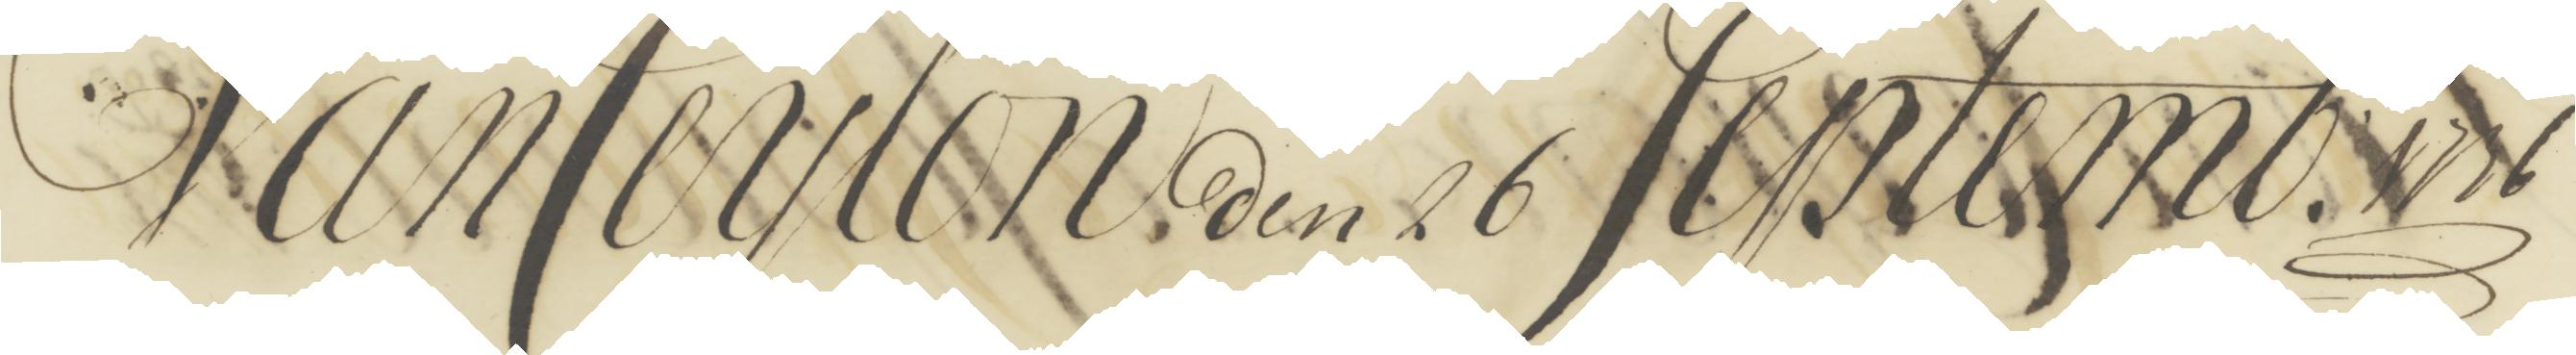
Van Ceylon den 26 Septemb:r 1736
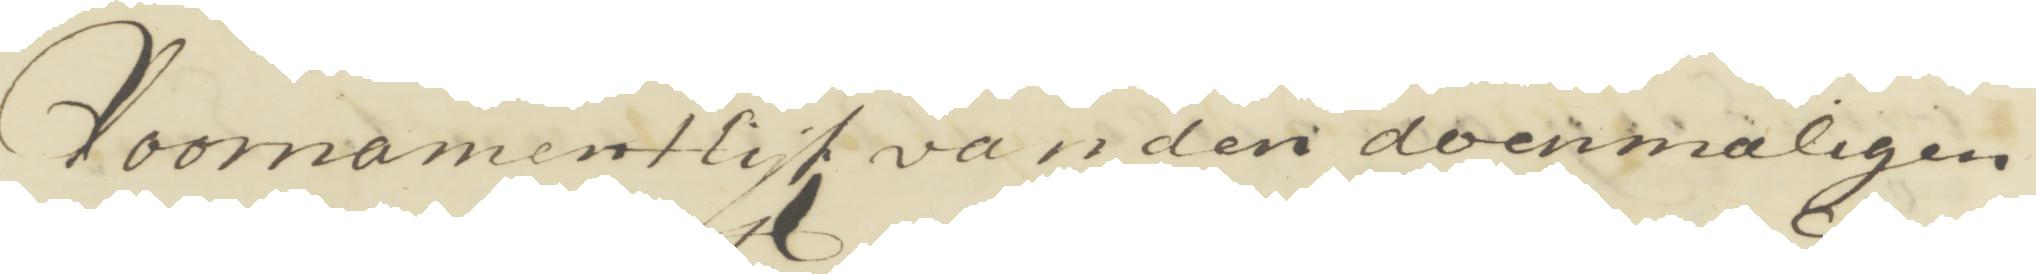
Voornamentlijk van den doenmaligen
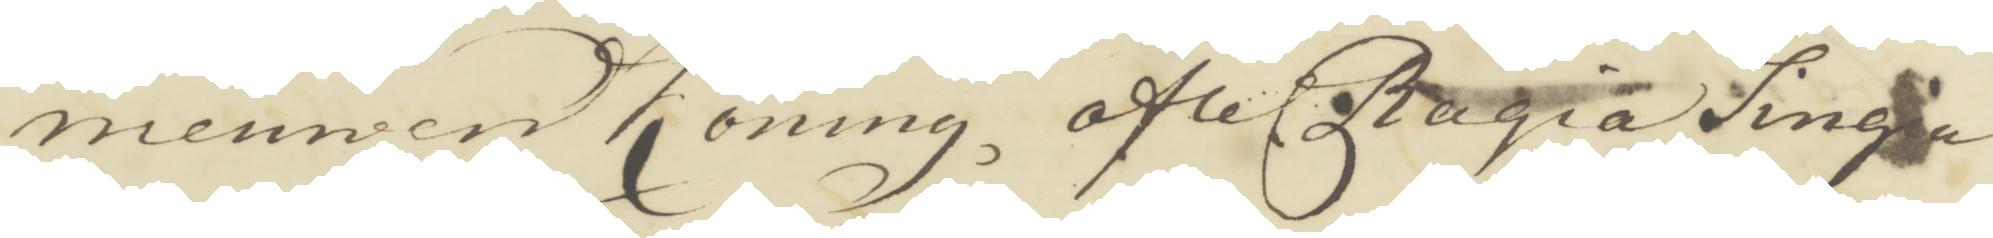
nieuwen Koning, ofte Ragia Singin
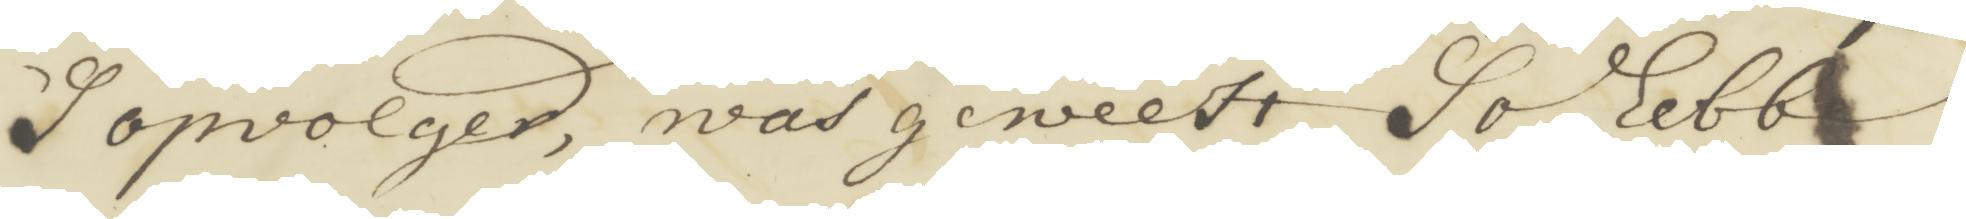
'S opvolger, was geweest so hebbe
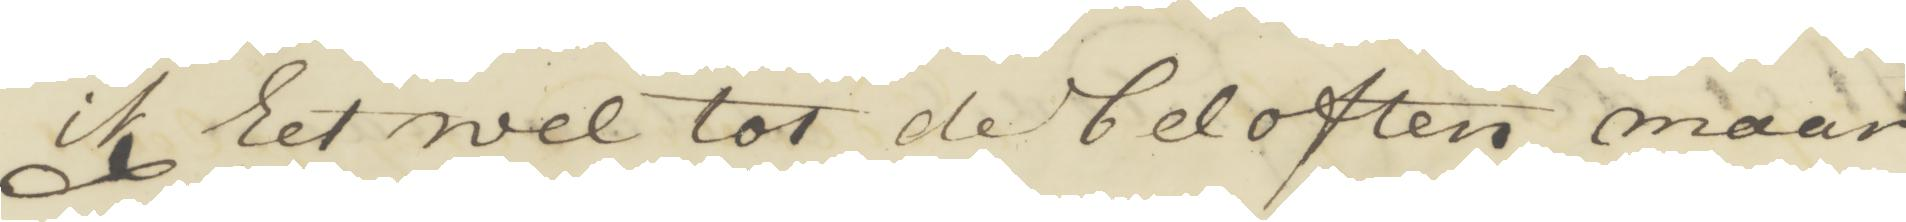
ik het wel tot de beloften maar
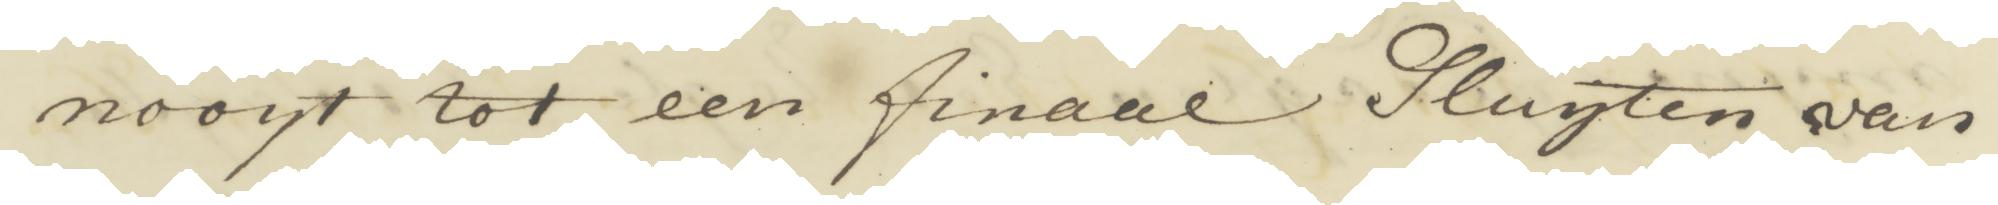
nooyt tot een finaal sluijten van
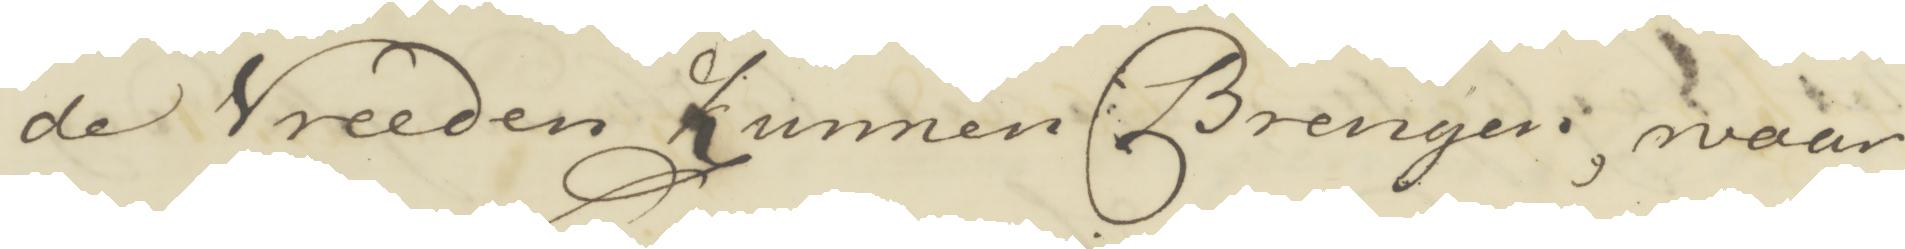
de Vreeden kunnen Brengen, waar
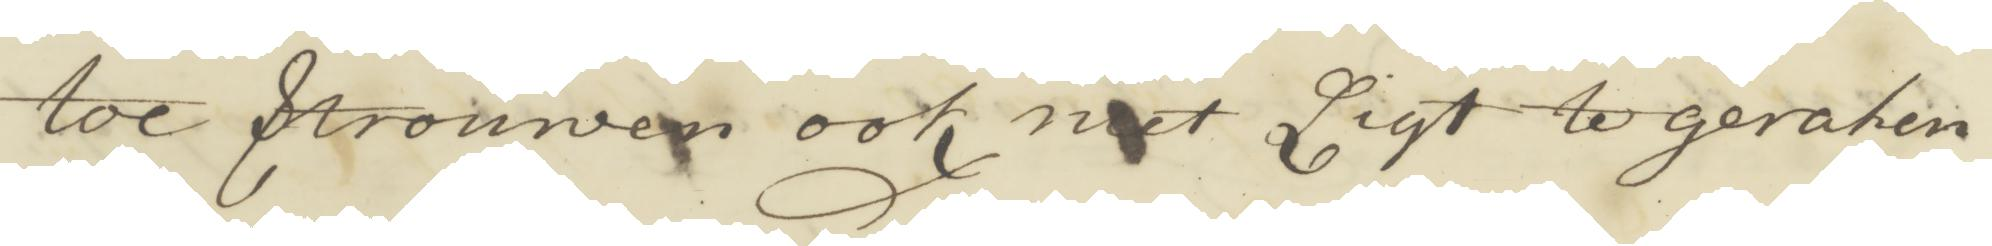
toe vertrouwen ook niet Ligt te geraken
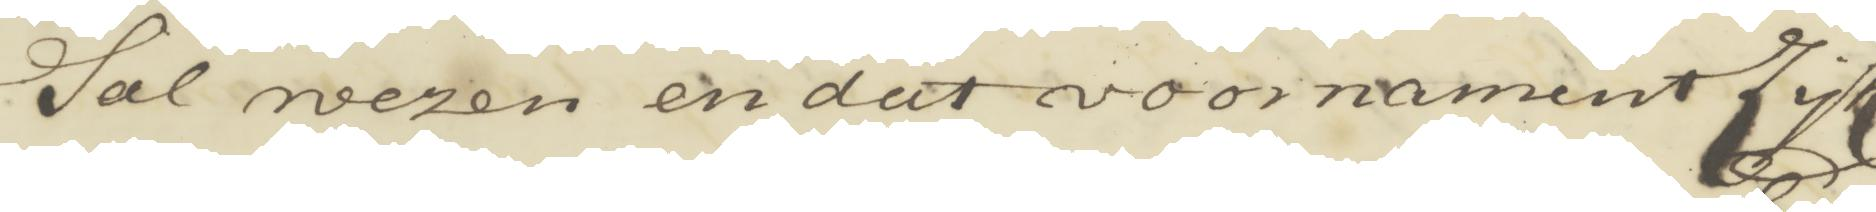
sal wezen en dat voornamentlijk
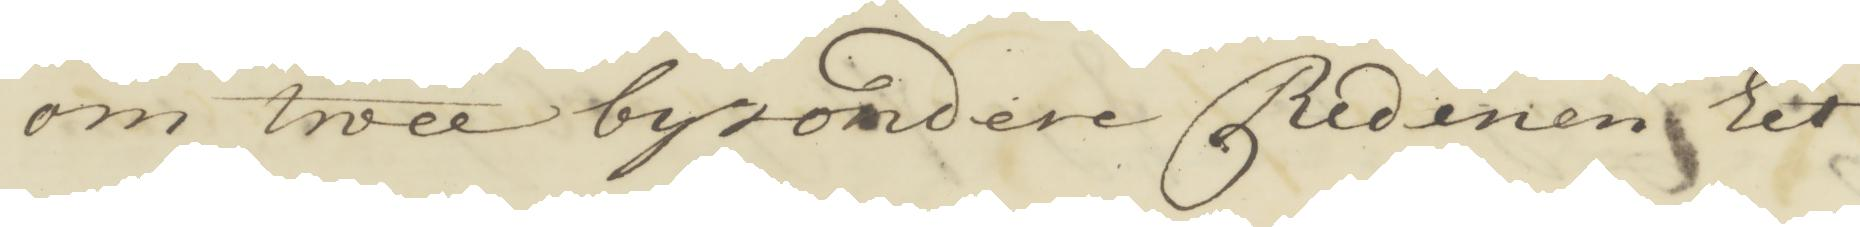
om twee byzondere Redenen het
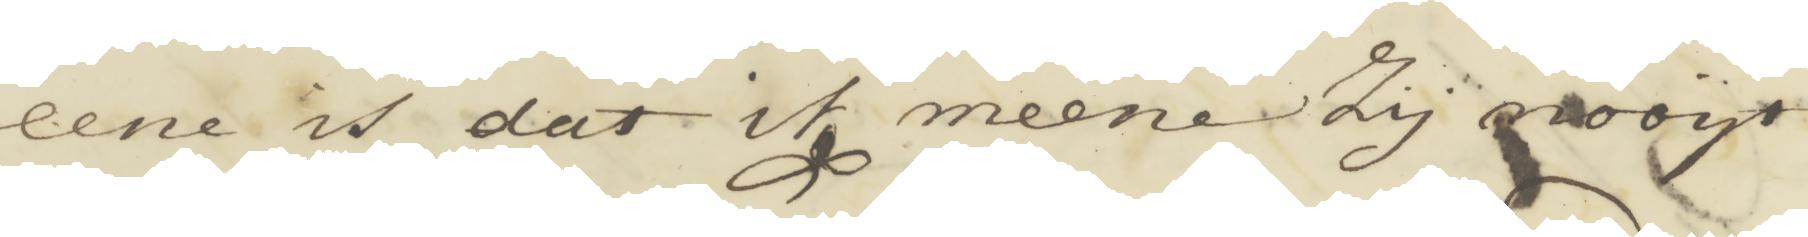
eene is dat ik meene zij nooijt
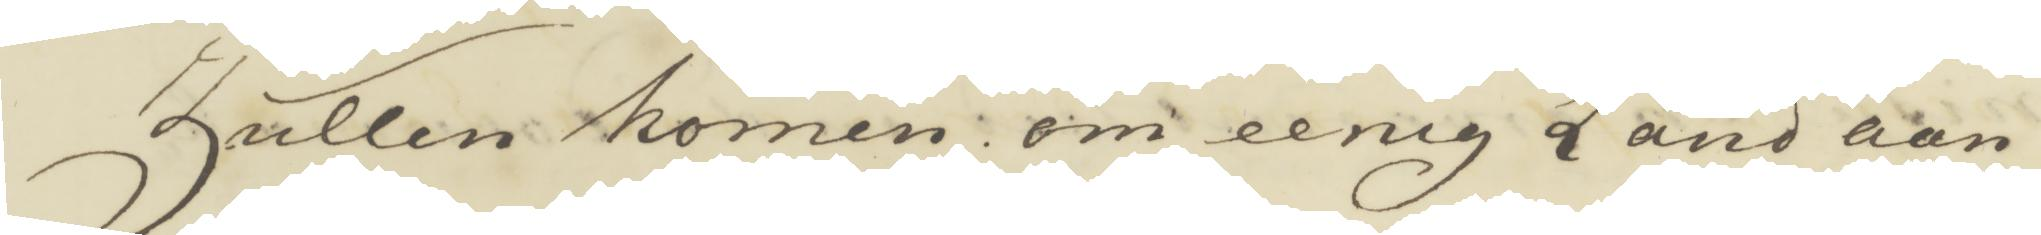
zullen komen om eenig Land aan
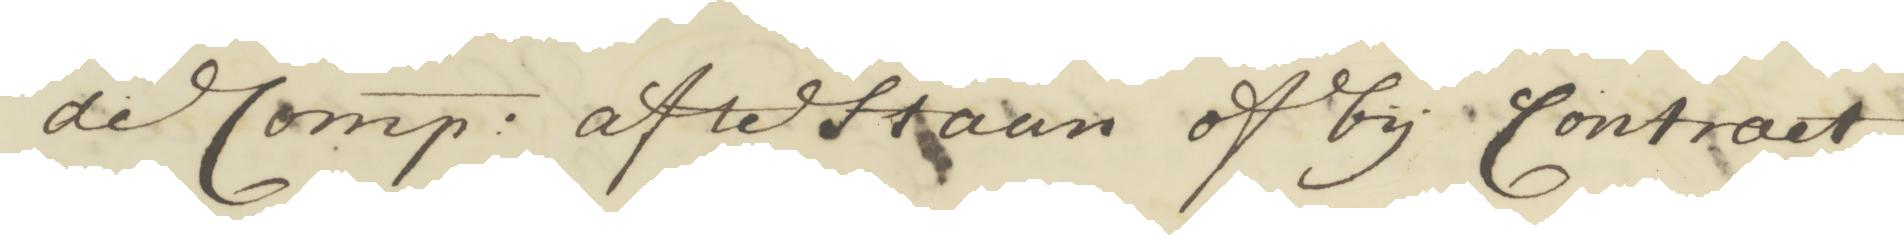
de Comp: aftestaan of bij Contract
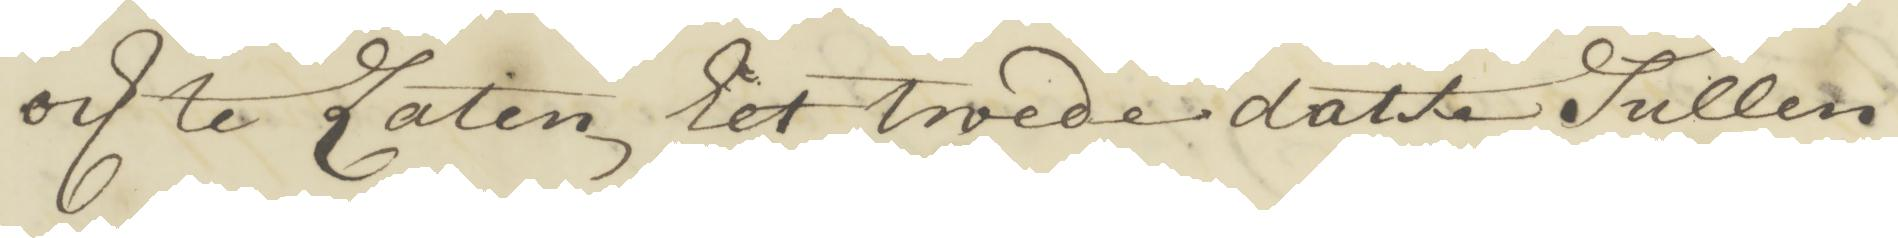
over te Laten, het twede datse Sullen
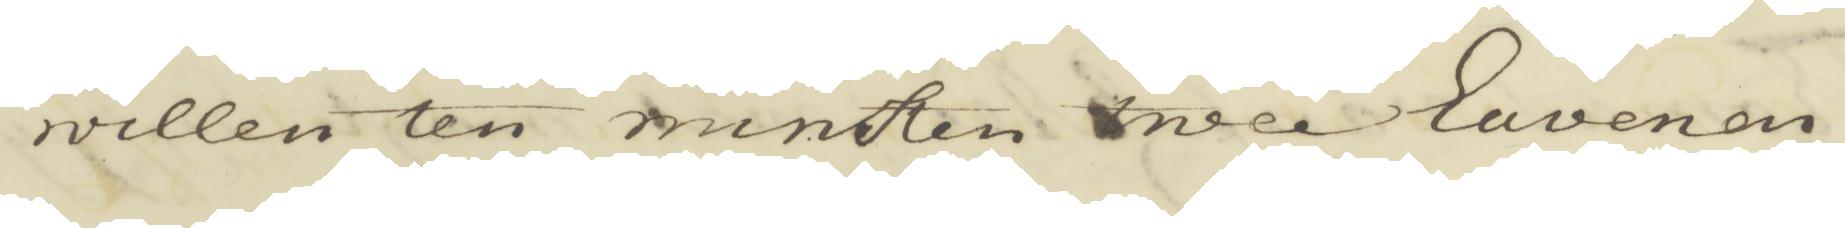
willen ten minsten twee havenen
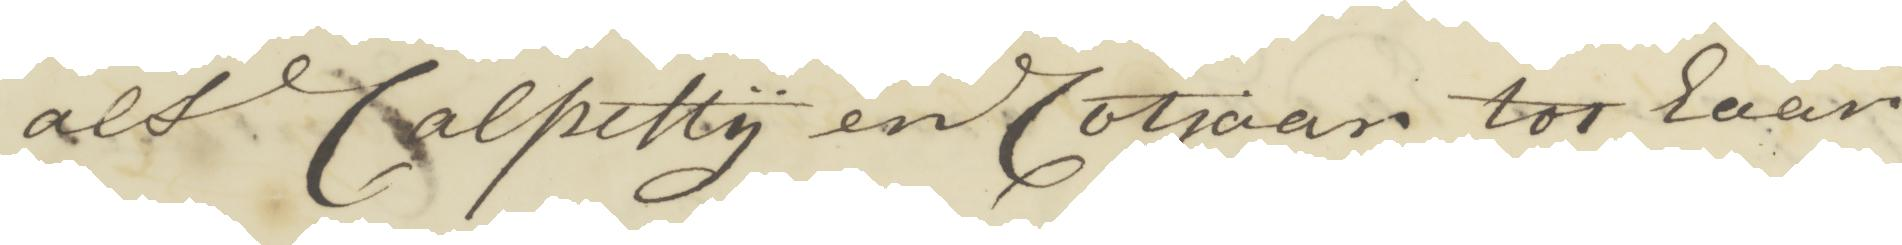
als Calpittij en Cotjaar, tot haar
